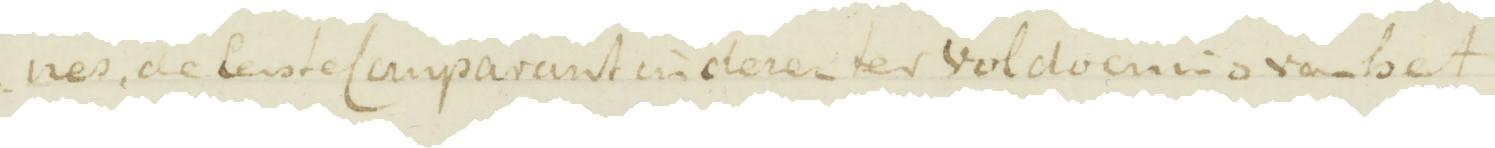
nes, de Eerste Comparant in dezen ter voldoening van het
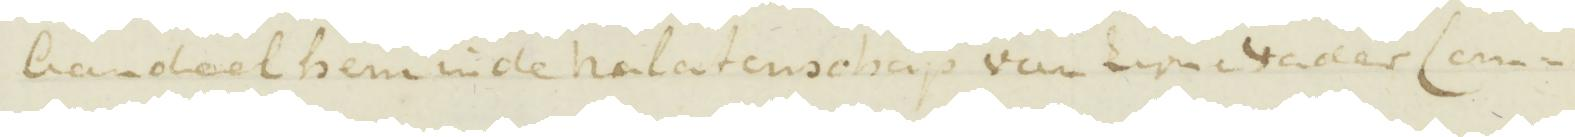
Aandeel hem in de nalatenschap van zyn vader Com=
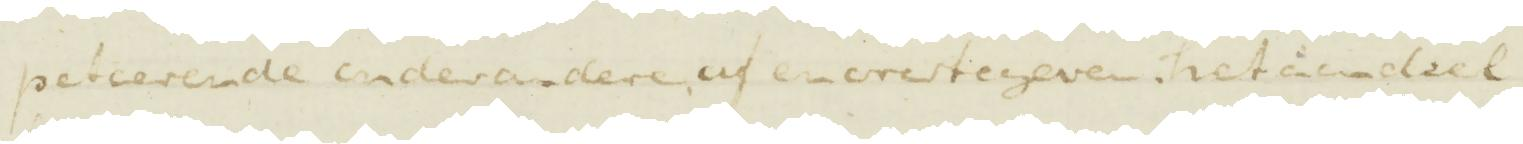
peteerende onder andere, of en overtegeven het aandeel
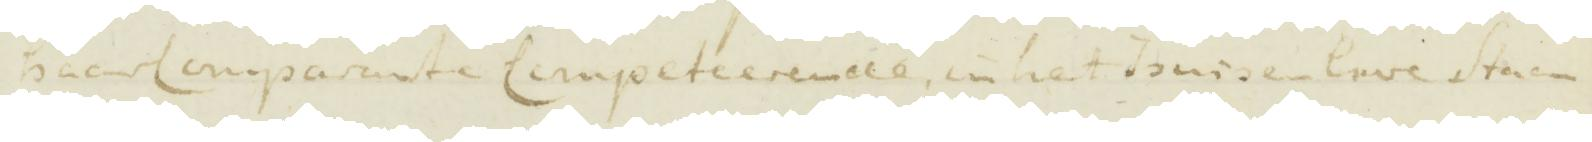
haar Comparante Competeerende, in het huis en Erve staan
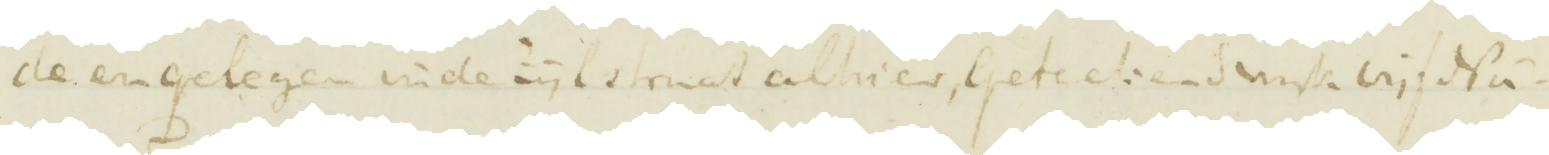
de en gelegen in de zijlstraat alhier, Geteekend wyk vijf Nu
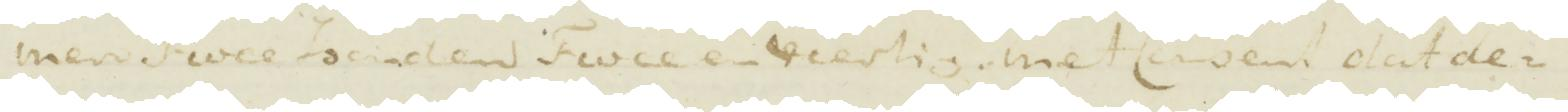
mero Twee honderd Twee en veertig, met Consent dat der
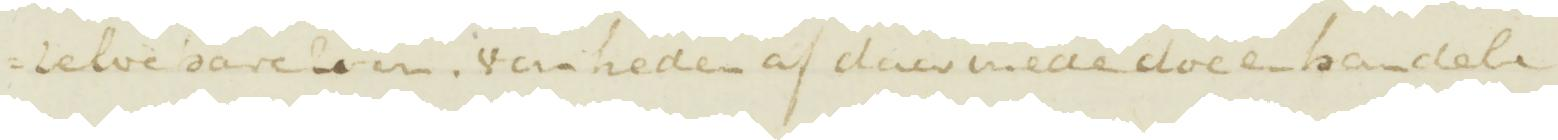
=zelve hare zoon: van heden af daar mede doe en handele
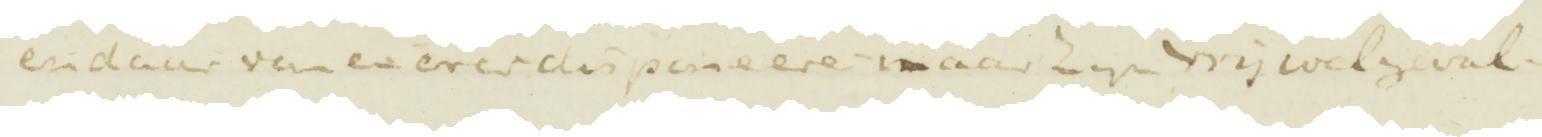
en daar van en over disponeeren maar zijn wij welgeval-
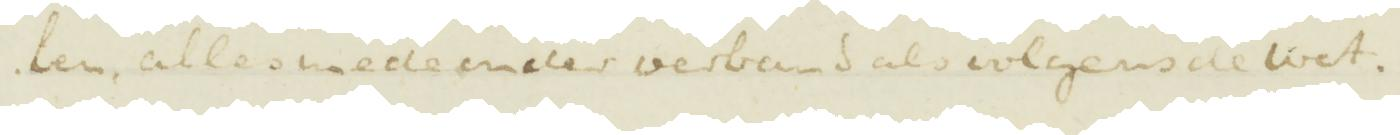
.len, alles mede onder verband als volgens de wet.
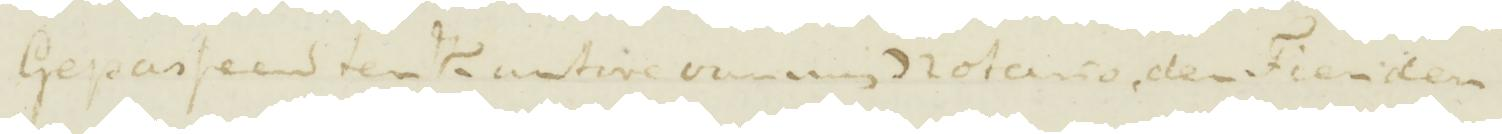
Gepasseerd ten Kantore van mij Notaris, den Tienden
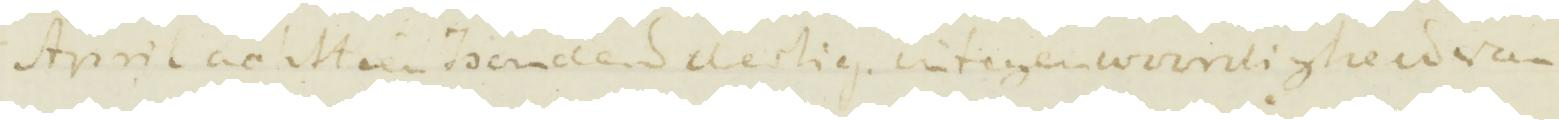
April achttien honderd dertig. in tegenwoordigheid van
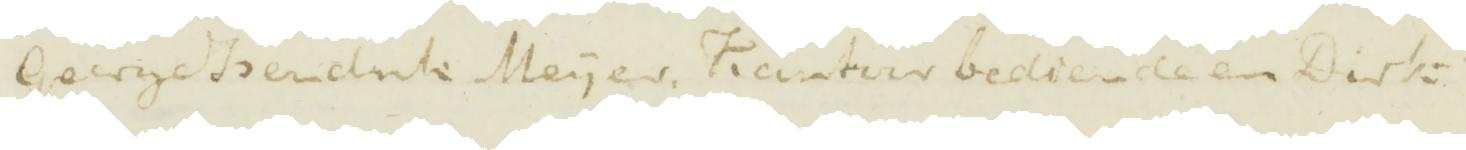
George Hendrik Meijer, Kantoor bediende en Dirk
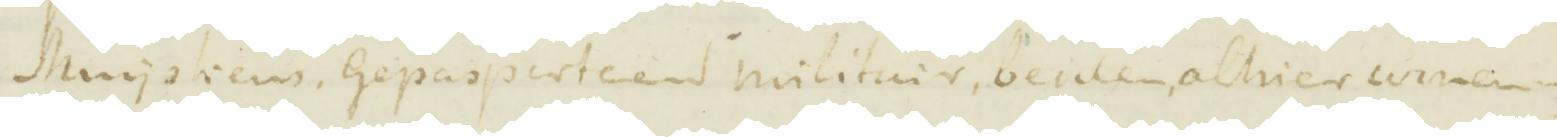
Muijskens, Gepasporteerd militair, beiden, alhier wonen=
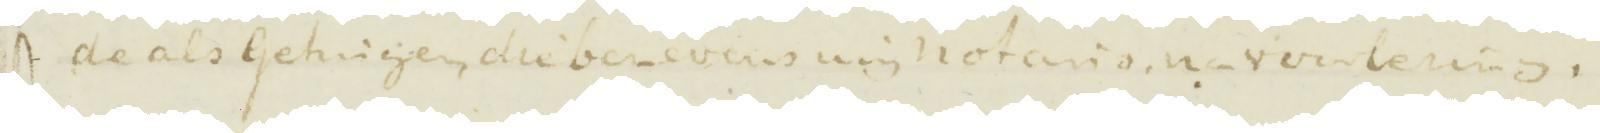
de als Getuigen, die benevens mij notaris, na voorlezing,
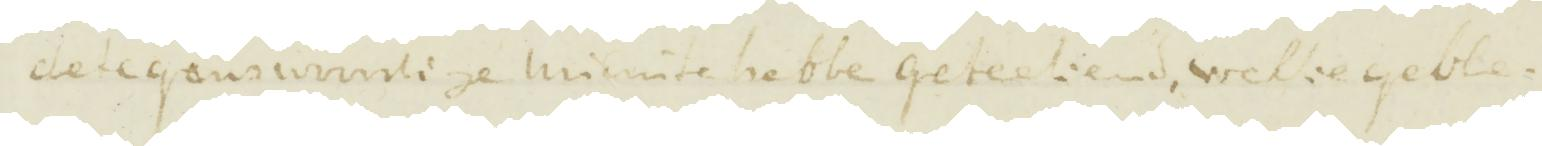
de tegenswoordige minute hebbe geteekend, welke geble=
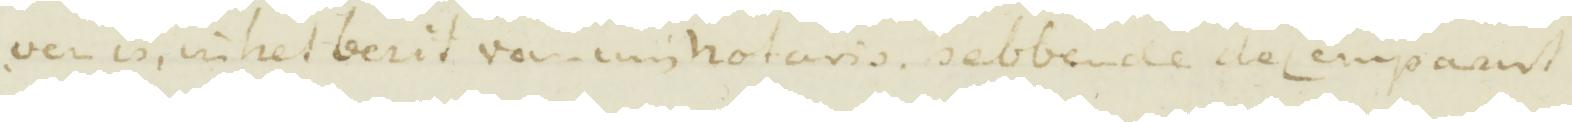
ven is, in het bezit van mij notaris, hebbende de Comparant
